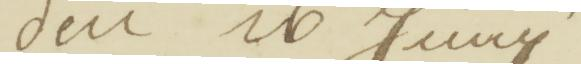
den 16 Junij
